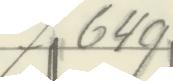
ƒ 649
